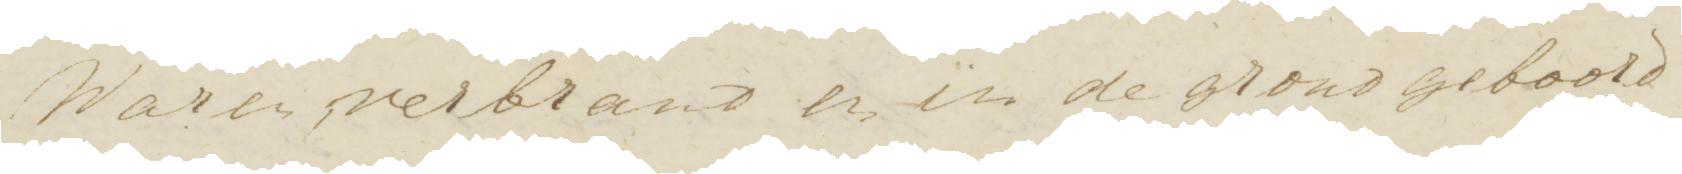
waren, verbrand en in de grond geboord
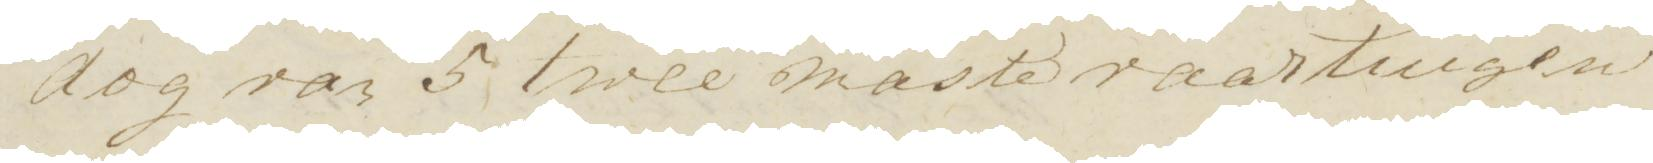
dog van 5 twee maste vaartuigen
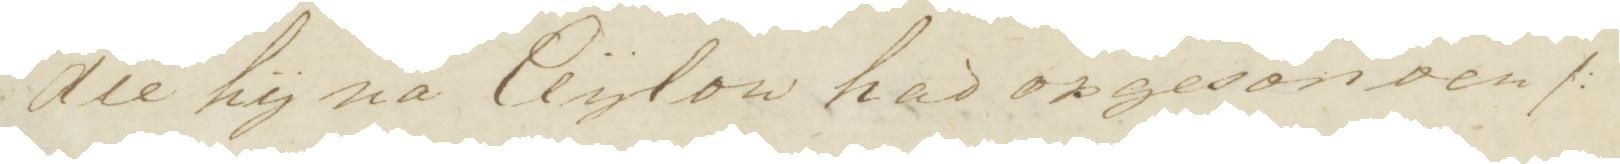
die hij na Ceijlon had opgesonden /:
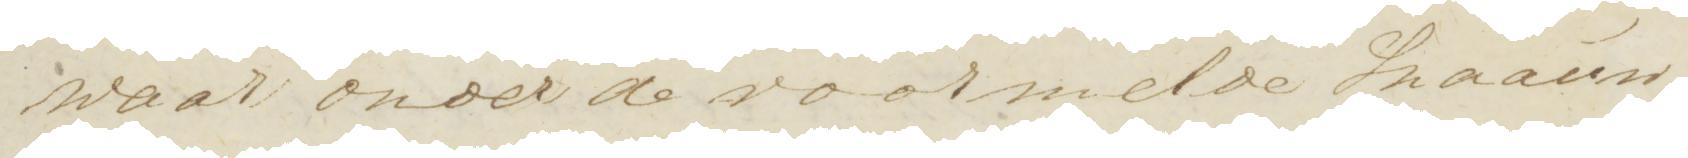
waar onder de voormelde Snaauw
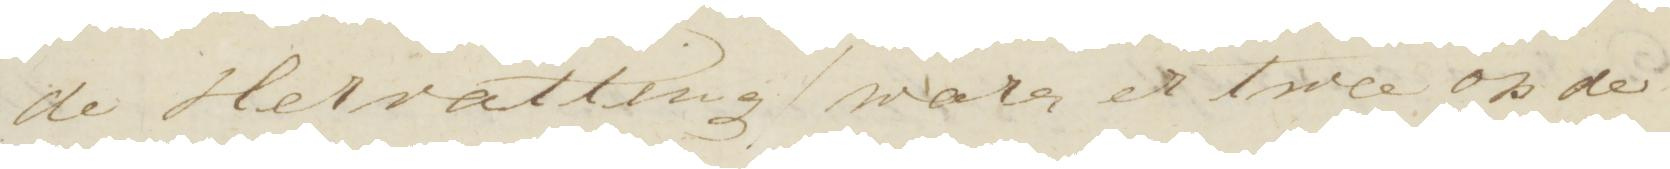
de Hervatting / waren er twee op de
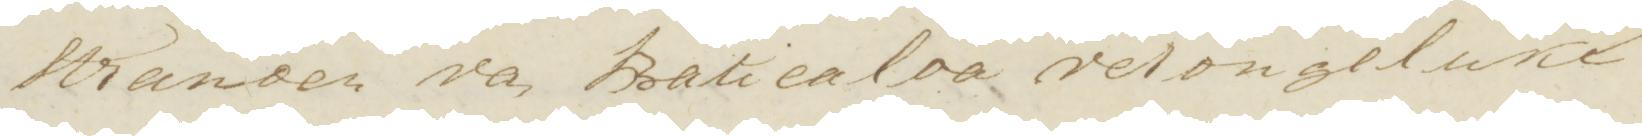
stranden van Baticaloa verongelukt
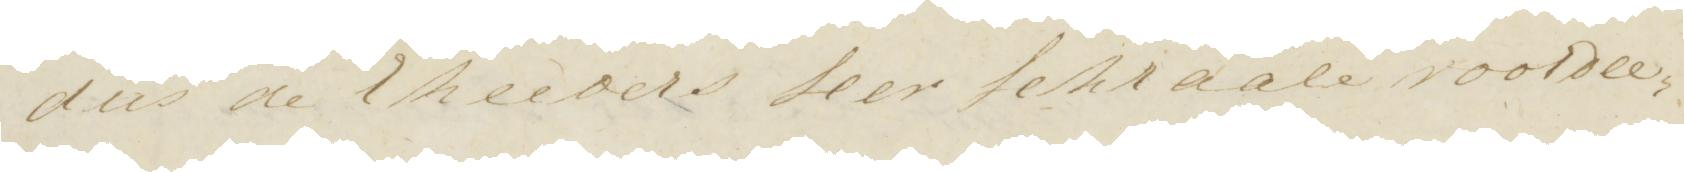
dus de rheeders seer schraale voordee„
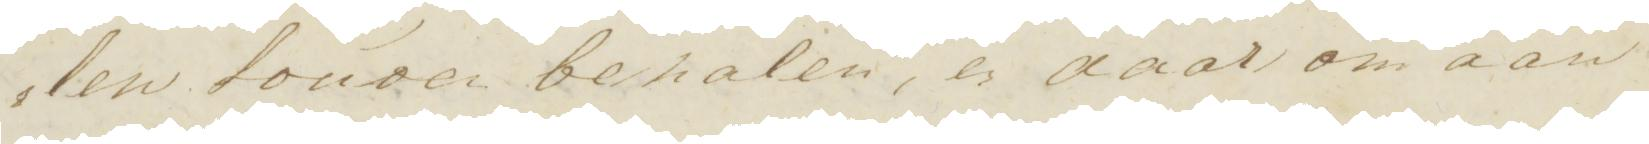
„len souden behalen, en daar om aan
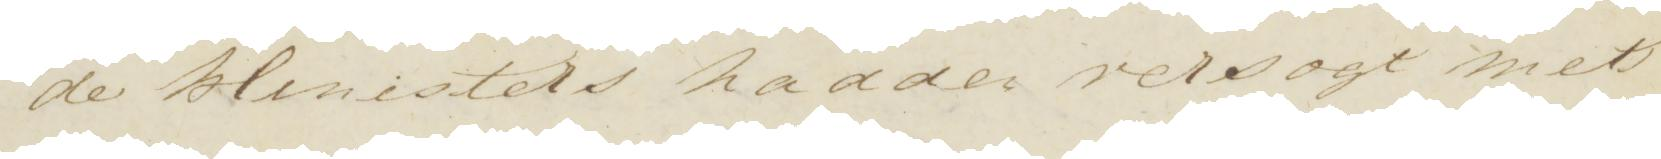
de Ministers hadden versogt met
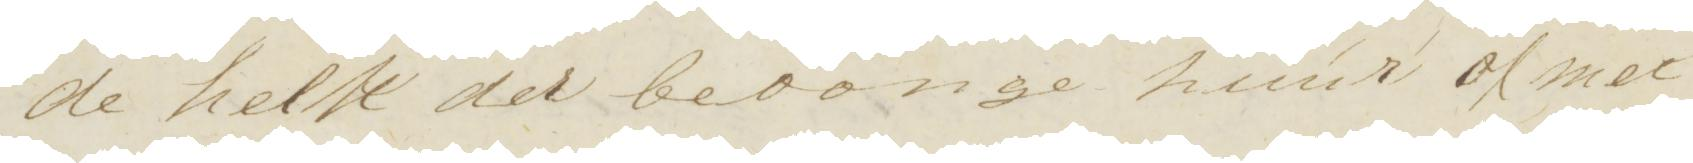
de helft der bedonge huur of met
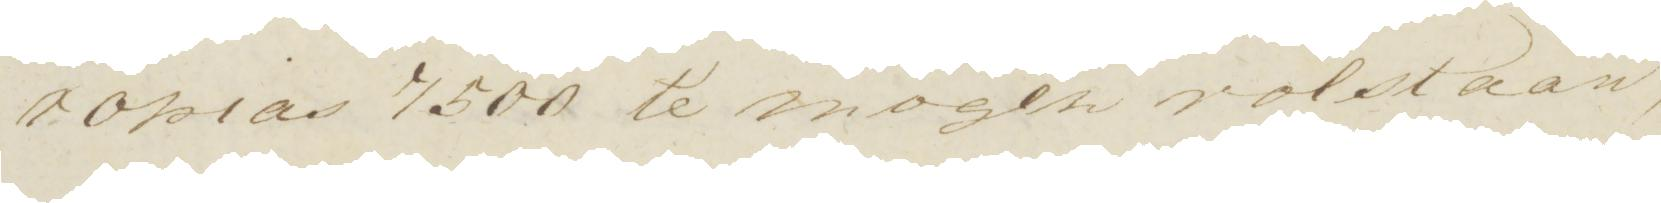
ropias 7500 te mogen volstaan,
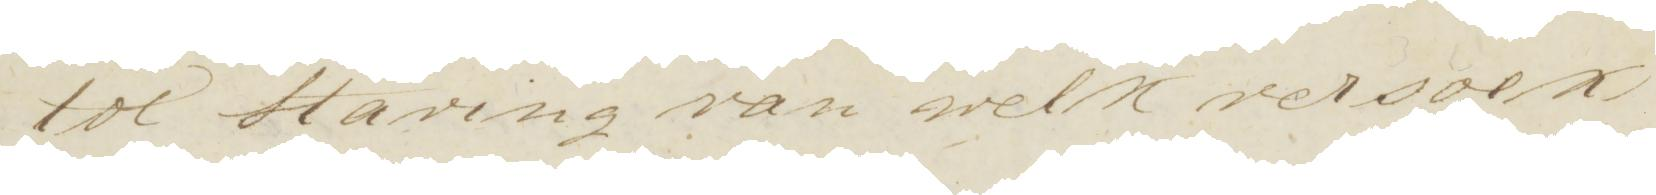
tot staving van welk versoek
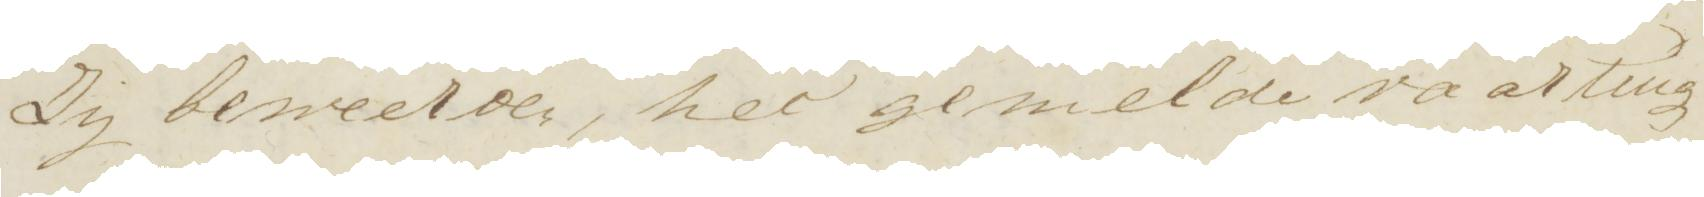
Zij beweerden, het gemelde vaartuig
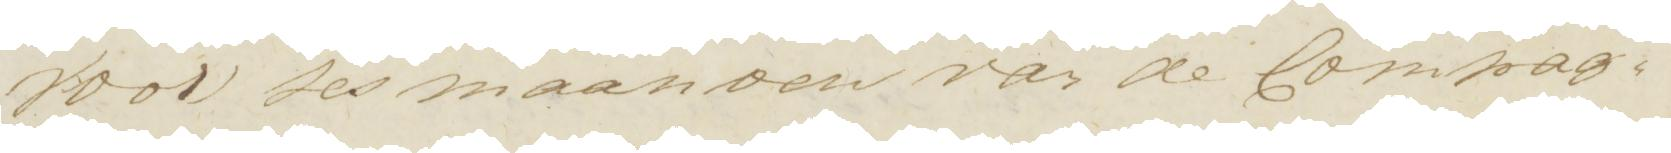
voor zes maanden van de Compag„
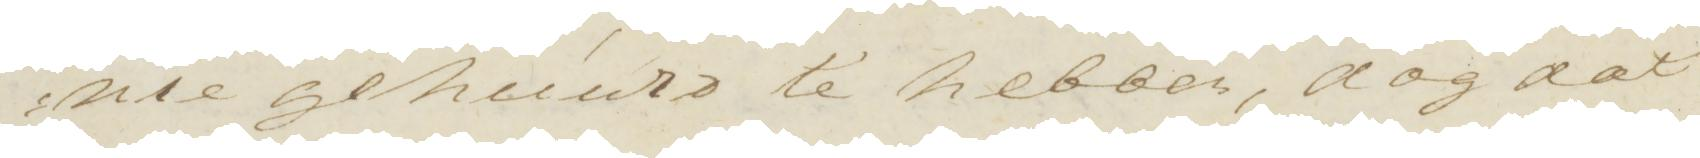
„nie gehuurd te hebben, dog dat
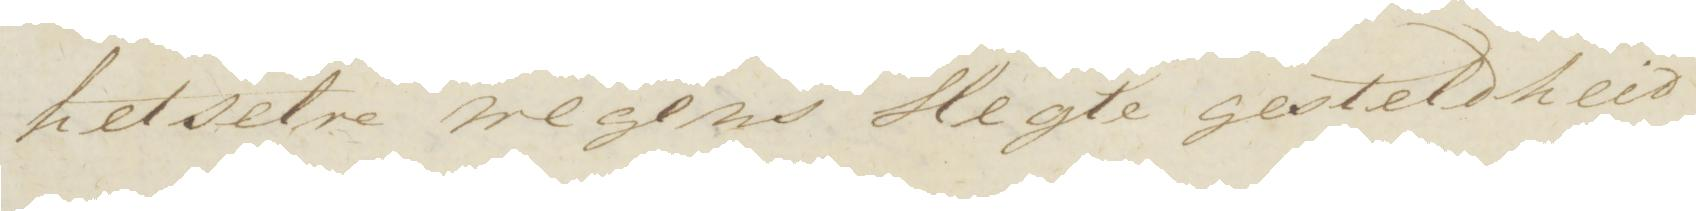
hetselve wegens slegte gesteldheid
